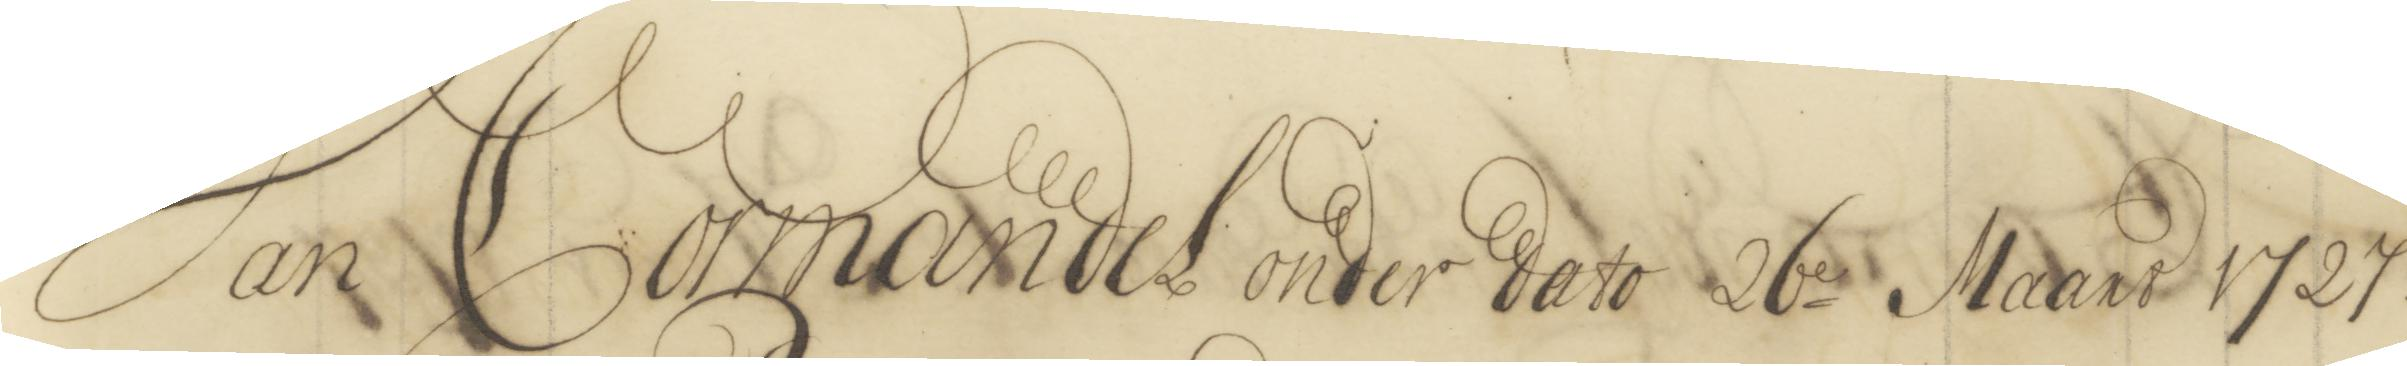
Van Cormandel onder dato 26=e Maart 1727
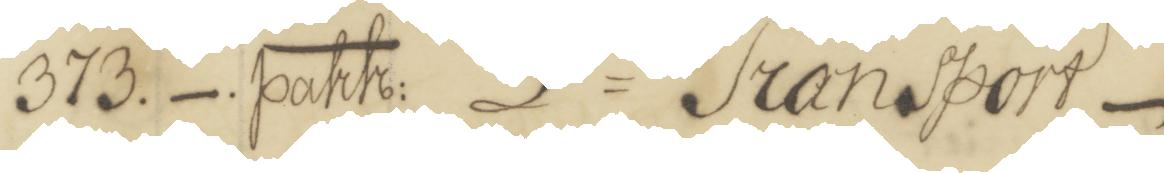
373. —. pakk: P=r Transport —
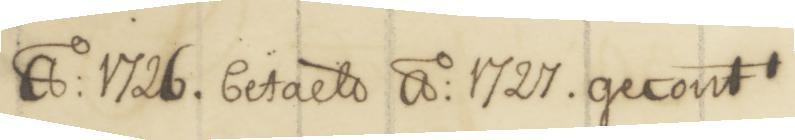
A:o 1726. betaeld A:o 1727. gecontt
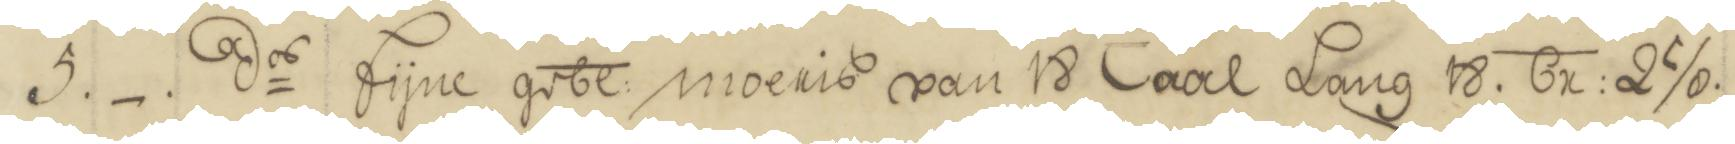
5. —. d=os fijne gebl: moeris van 18 Caal Lang 18. br: 2 5/8.
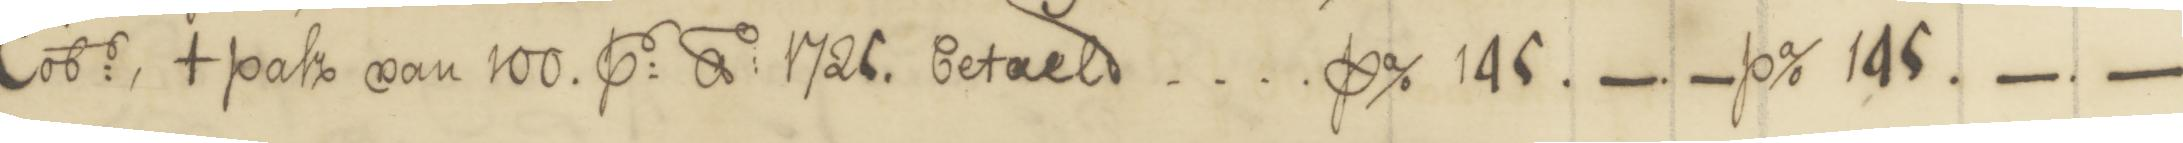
Cob:s, t pak van 100. p:s A:o 1725. betaeld - - - - p/oa 145. —. — p/oa 145. —. —
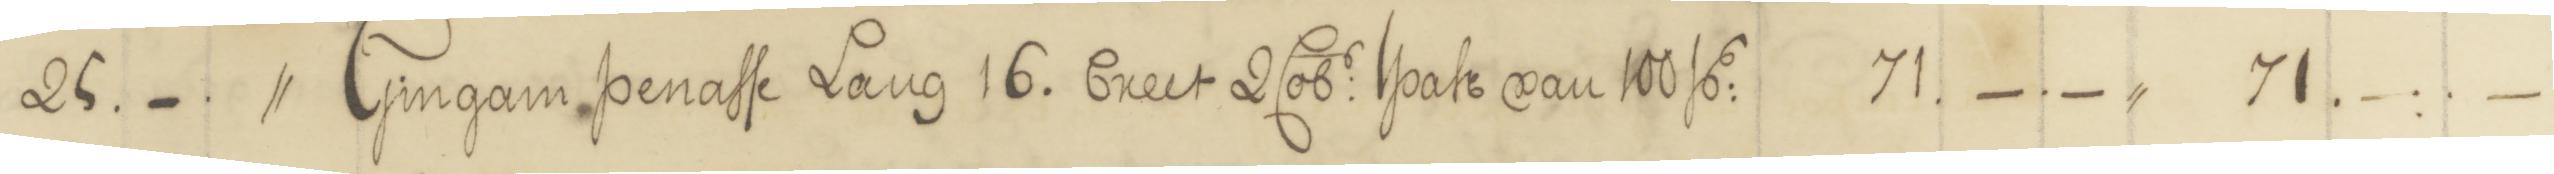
25. —. „ Gingam penasse Lang 16. breet 2 Cob:s tpak van 100 p:s 71. —. — „ 71. —. —
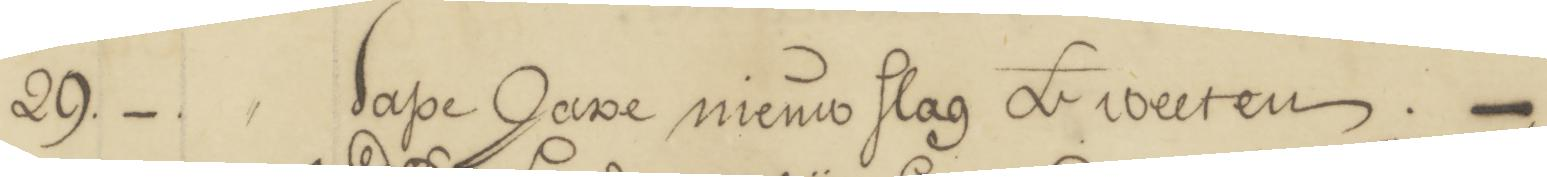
29. —. „ tape Jave nieuw slag te weeten. —
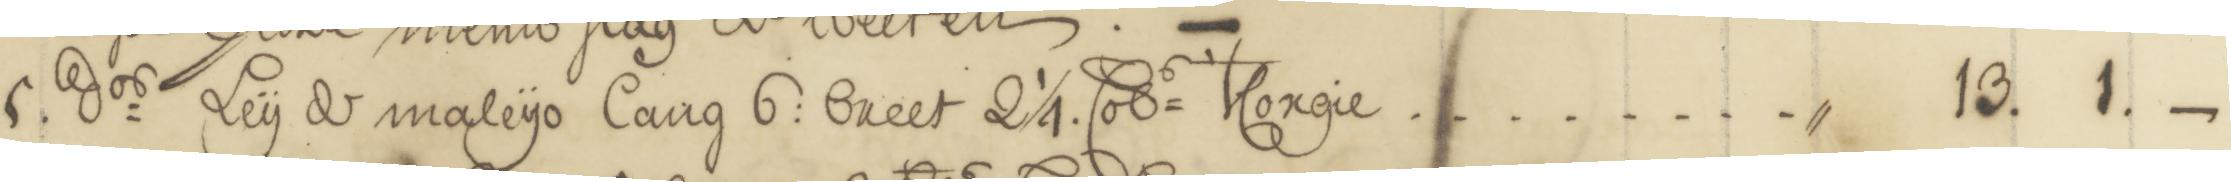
5. d=os Leij de maleijo lang 6: breet 2¼. Cob=s 't Corgie - - - - - - - - „ 13. 1. —
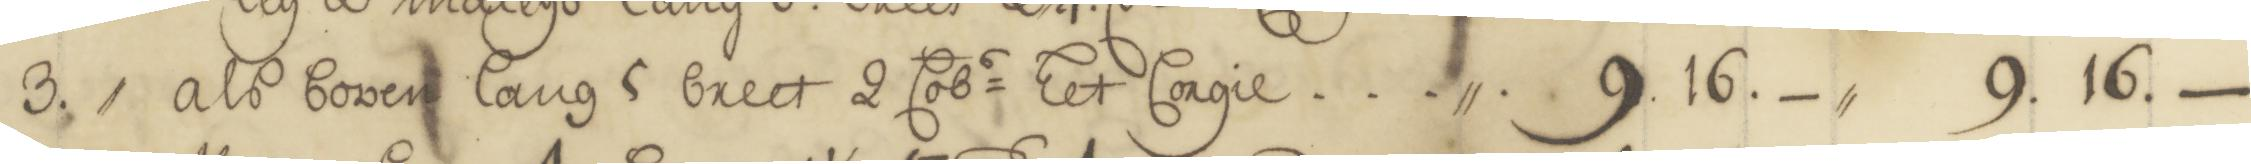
3. „ als boven lang 5 breet 2 Cob=s het Corgie - - - „ - 9. 16. — „ 9. 16. —
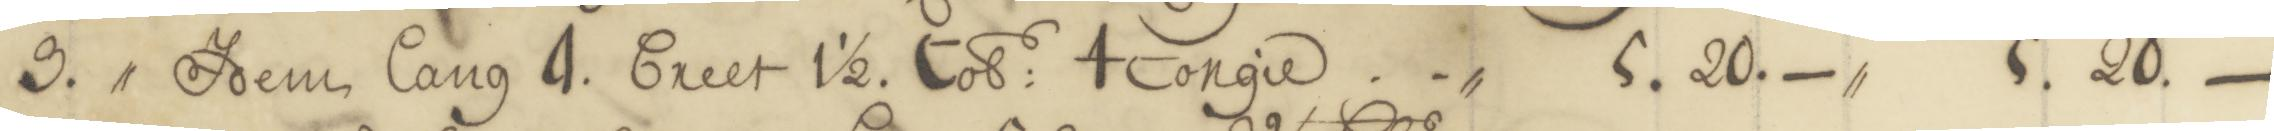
3. „ Idem lang 4. breet 1½. Cob:s t corgie - - „ 5. 20. — „ 5. 20. —
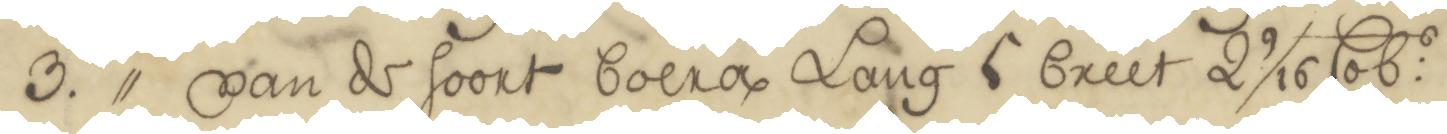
3. „ van de soort boera Lang 5 breet 2 9/16 Cob:s
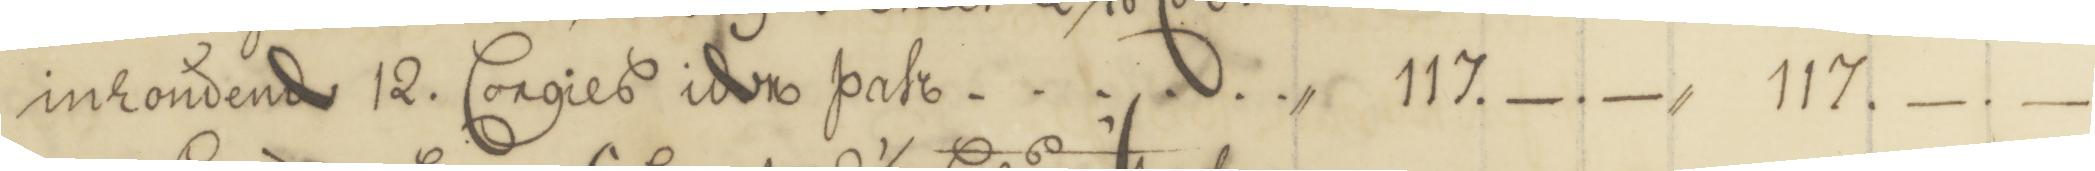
inhoudende 12. Corgies ider pak - - - - - - „ 117. —. — „ 117. —. —
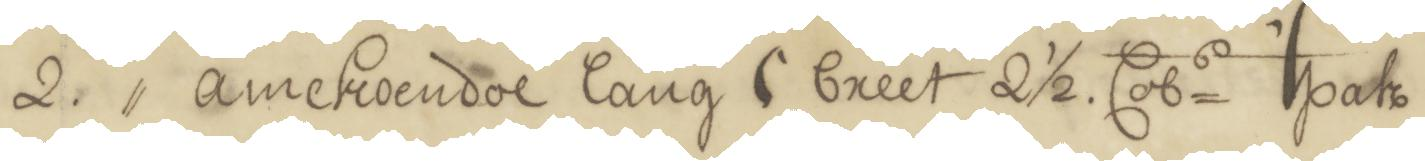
2. „ amekoendol lang 5 breet 2½. Cob=s 'tpak
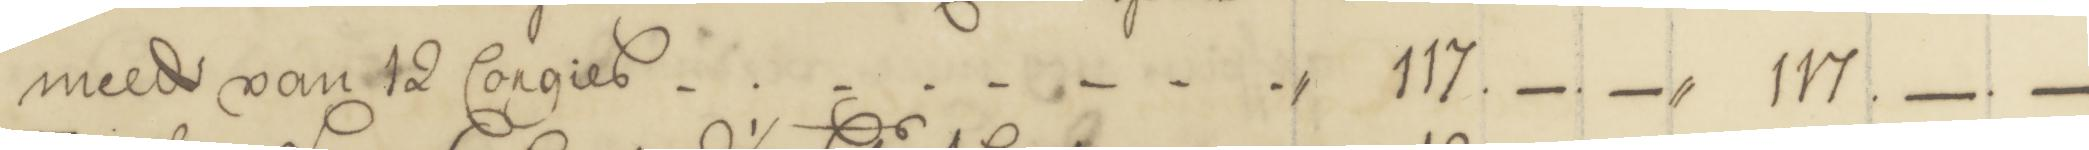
meede van 12 Corgies - - - - - - - - „117. —. —„117. —. —
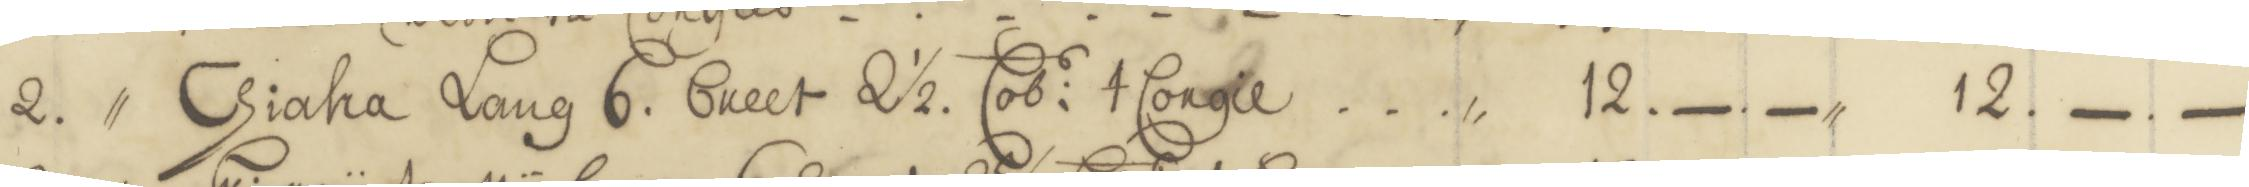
2. „ Chiaka Lang 6. breet 2½. Cob:s t Corgie - - - „ 12. —. —„ 12. —. —
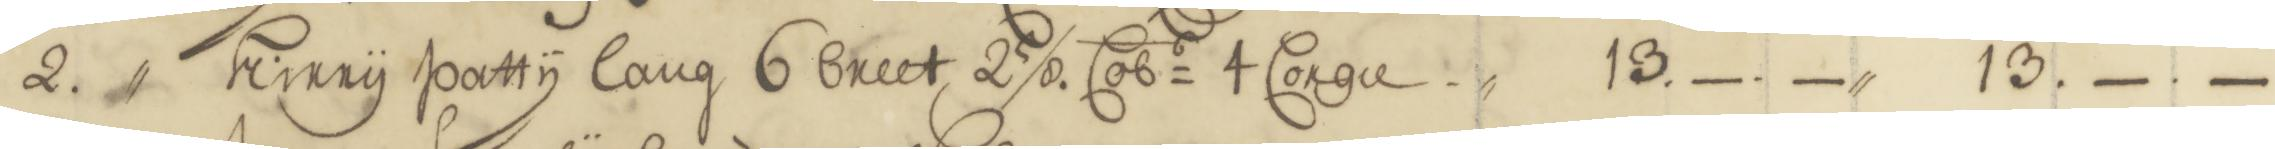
2. „ kirrij pattij lang 6 breet 2 5/8. Cob=s t Corgie - „ 13. —. —„ 13. —. —
